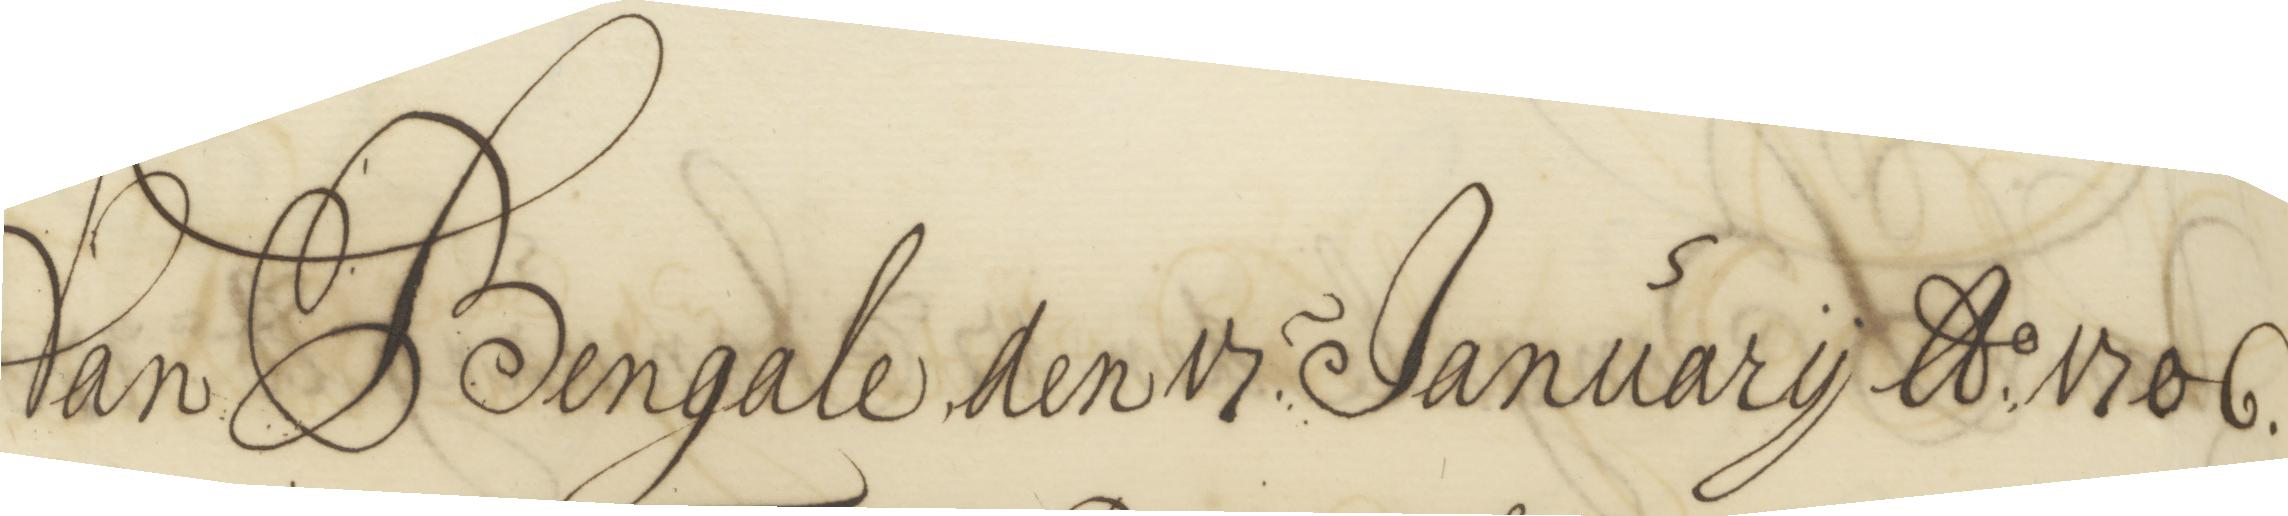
Van Bengale den 17:' Januarij A:o 1706.
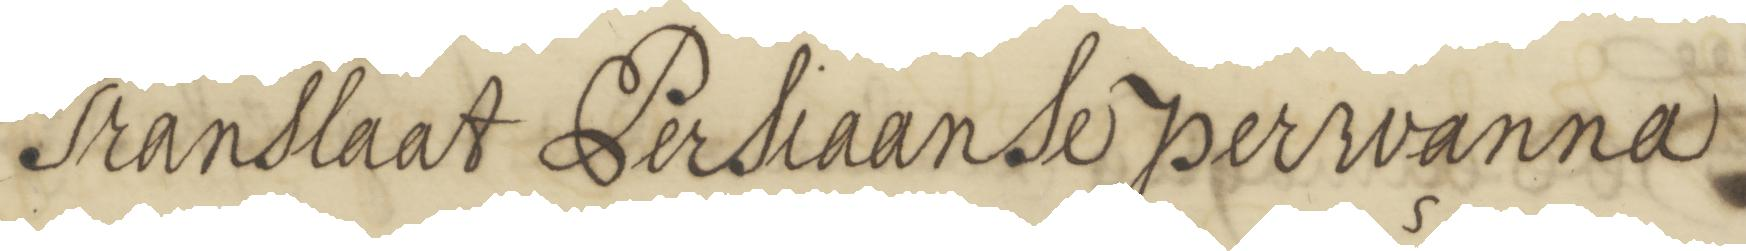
Translaat Persiaanse perwanna
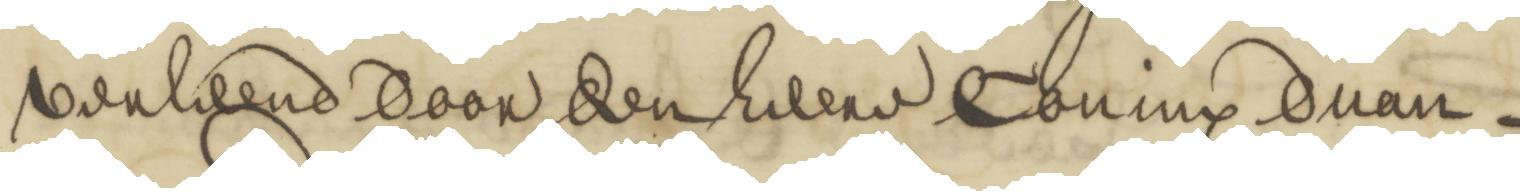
verleend door den heere Coninx duan —
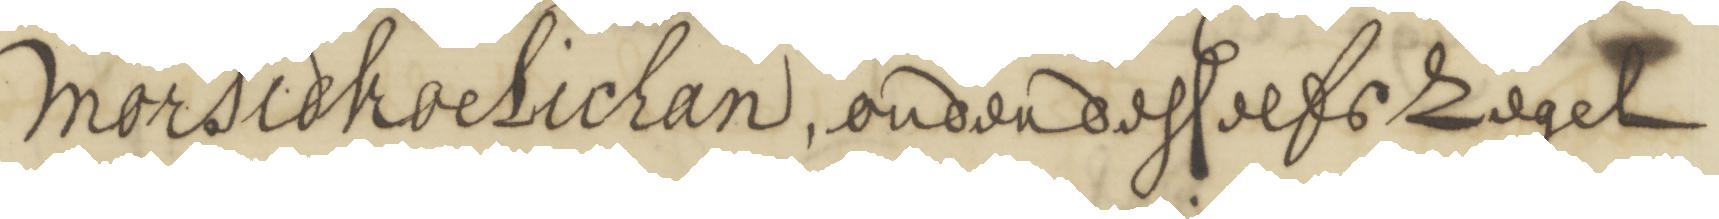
Morsidkoelichan, onder desselfs zegel
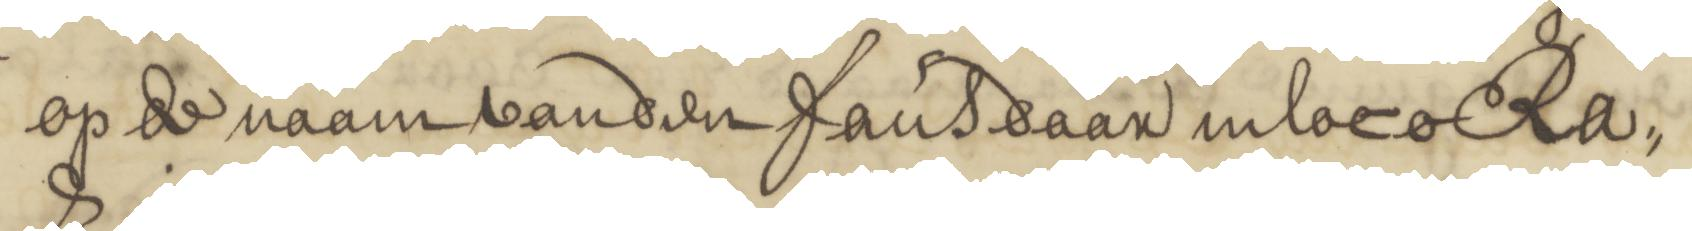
op de naam van den fausdaar in loco Ra„
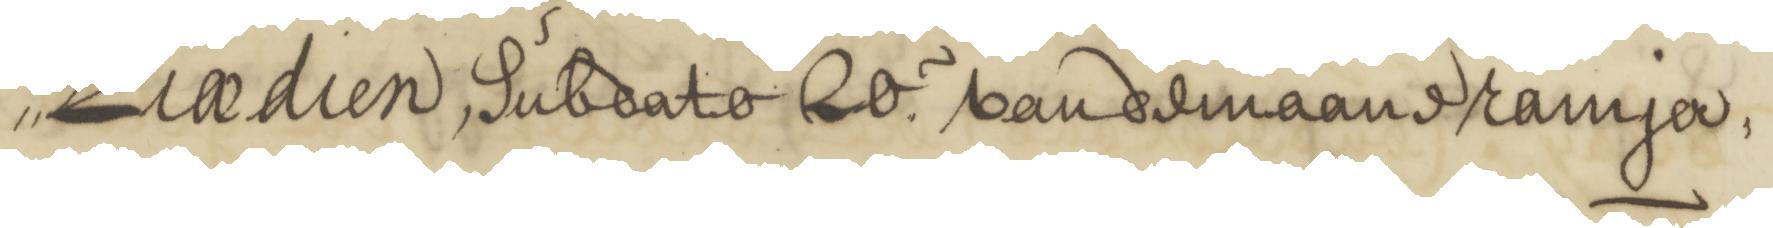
„ziaedien, sub dato 20.' van de maane ramja„
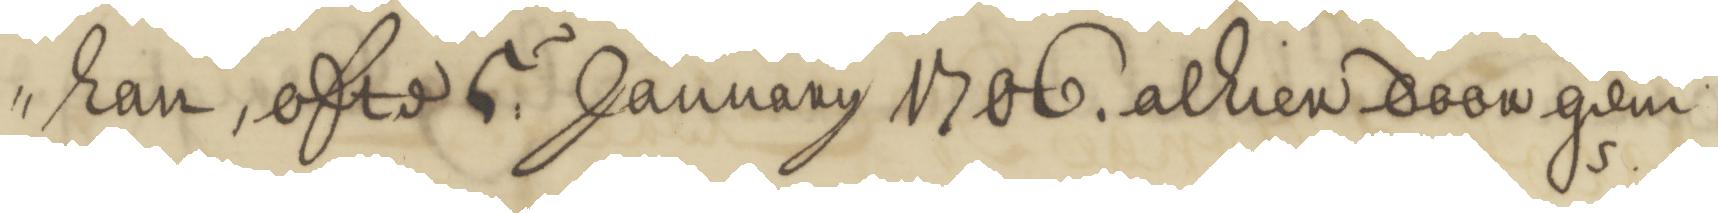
„han, ofte 5:' Januarij 1706. alhier door gem
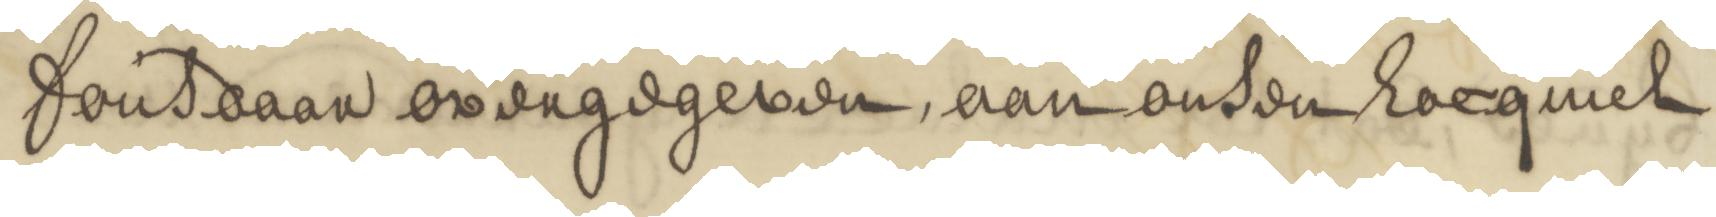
fousdaar overgegeven, aan onsen hocquiel
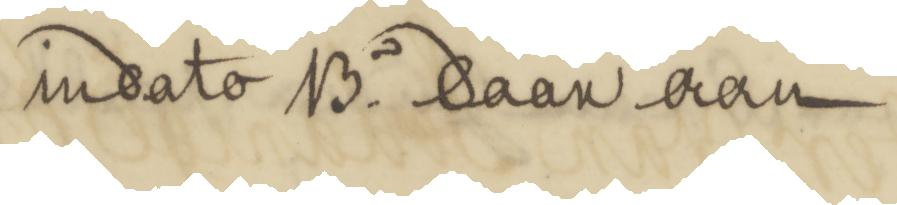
in dato 13.' daar aan
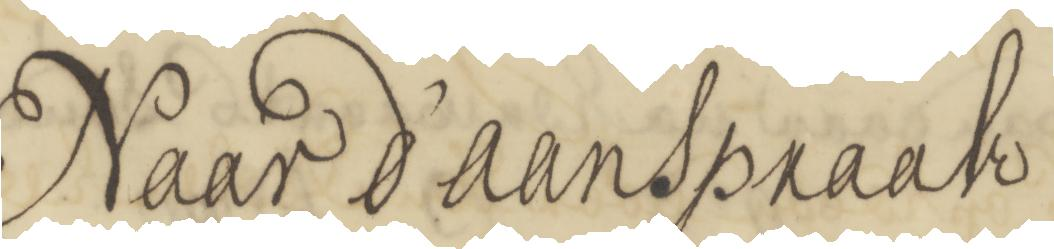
Naar d’aanspraak
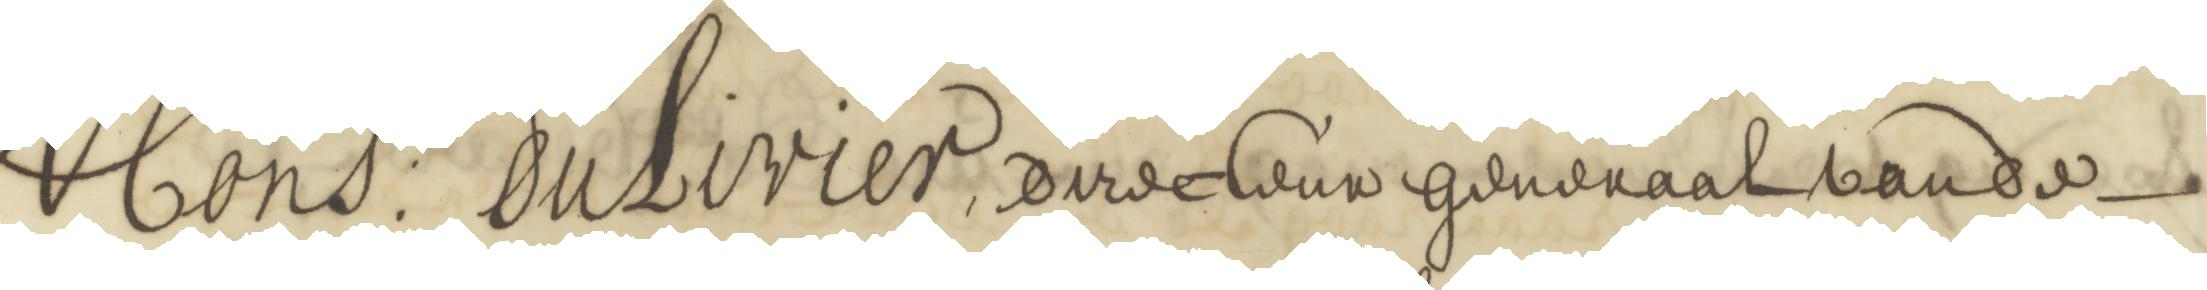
ons:r du Livier, directeur generaal vande
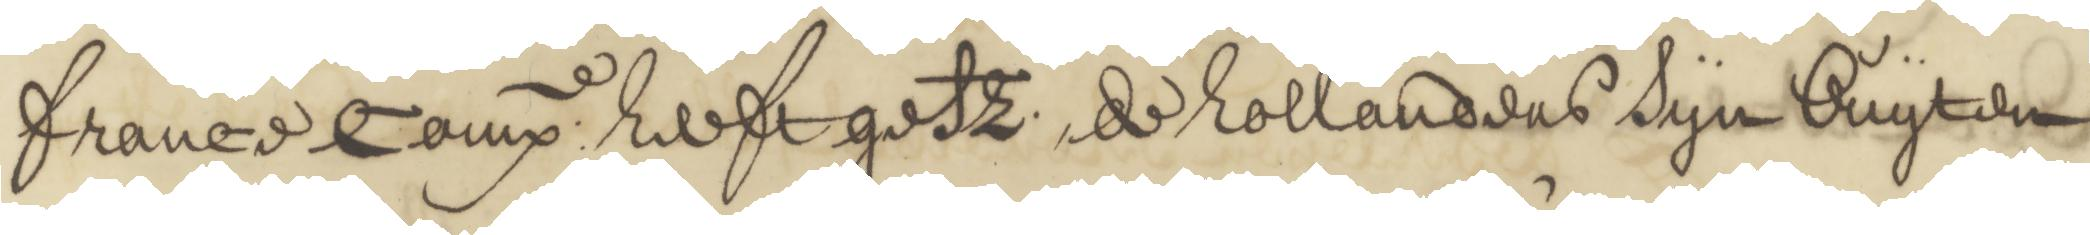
france Comp:e heeft gesz., de hollanders sijn buijten
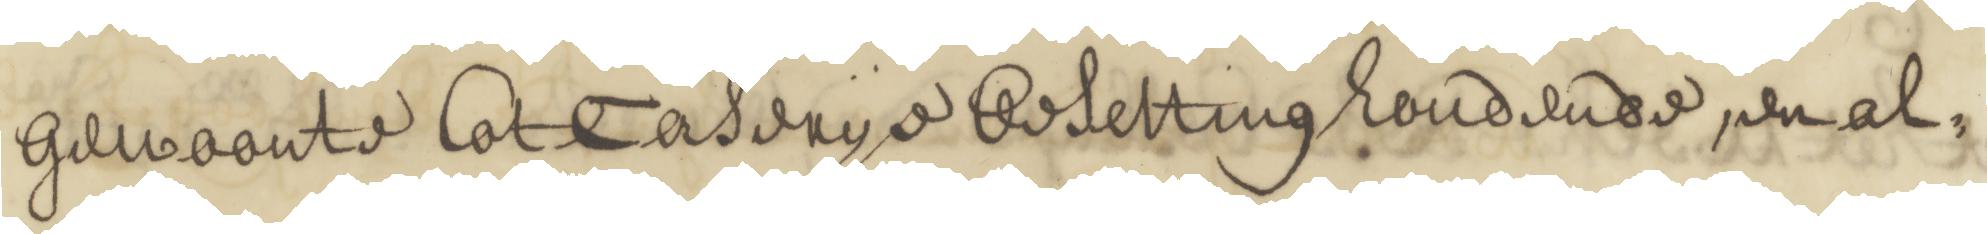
gewoonte tot Caserije besetting houdende, en al„
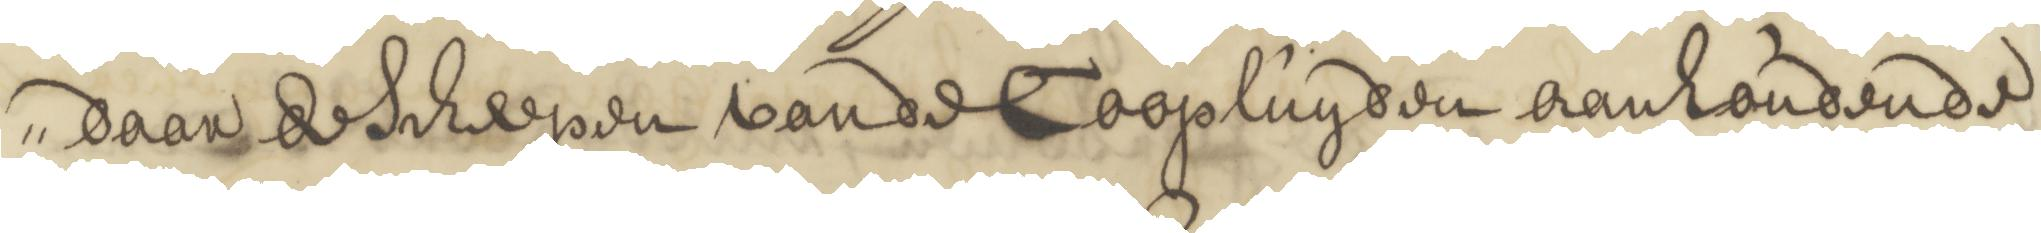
„daar de scheepen vande Coopluijden aanhoudende
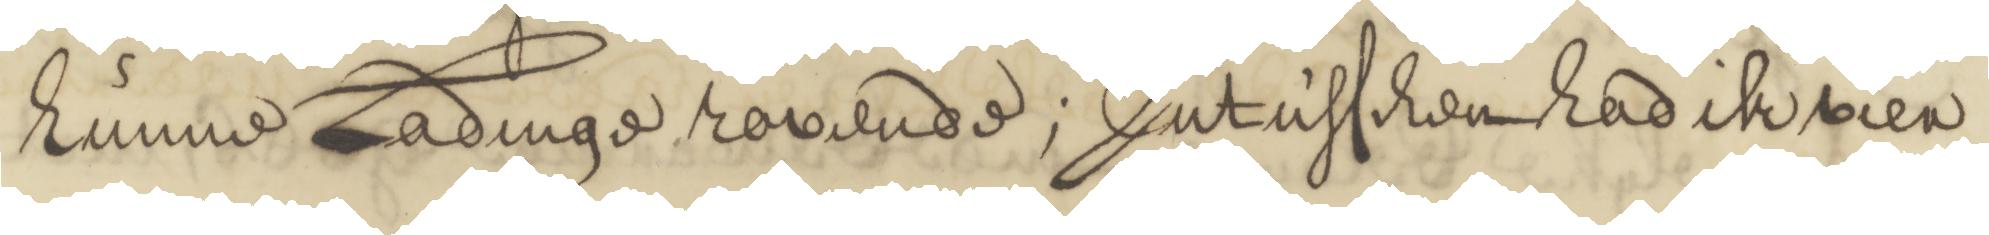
hunne Ladinge rovende; Jntusschen had ik vier
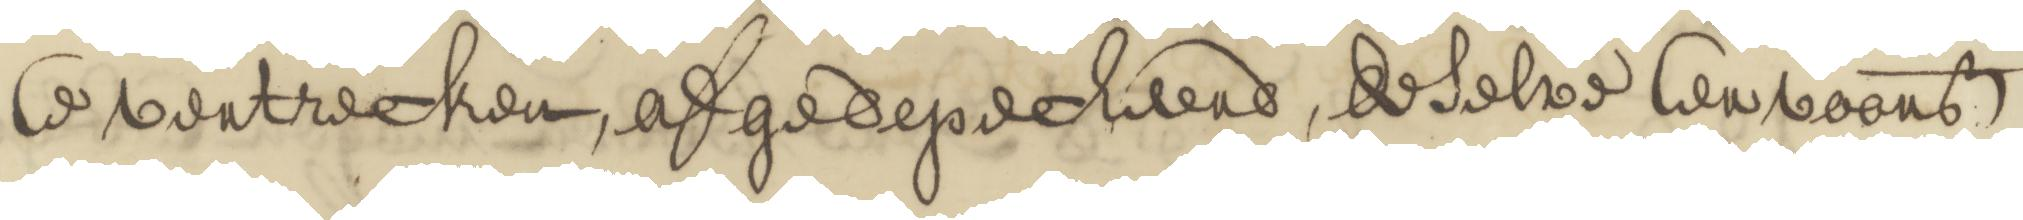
te vertrecken, afgedepecheerd, deselve ter voorst
